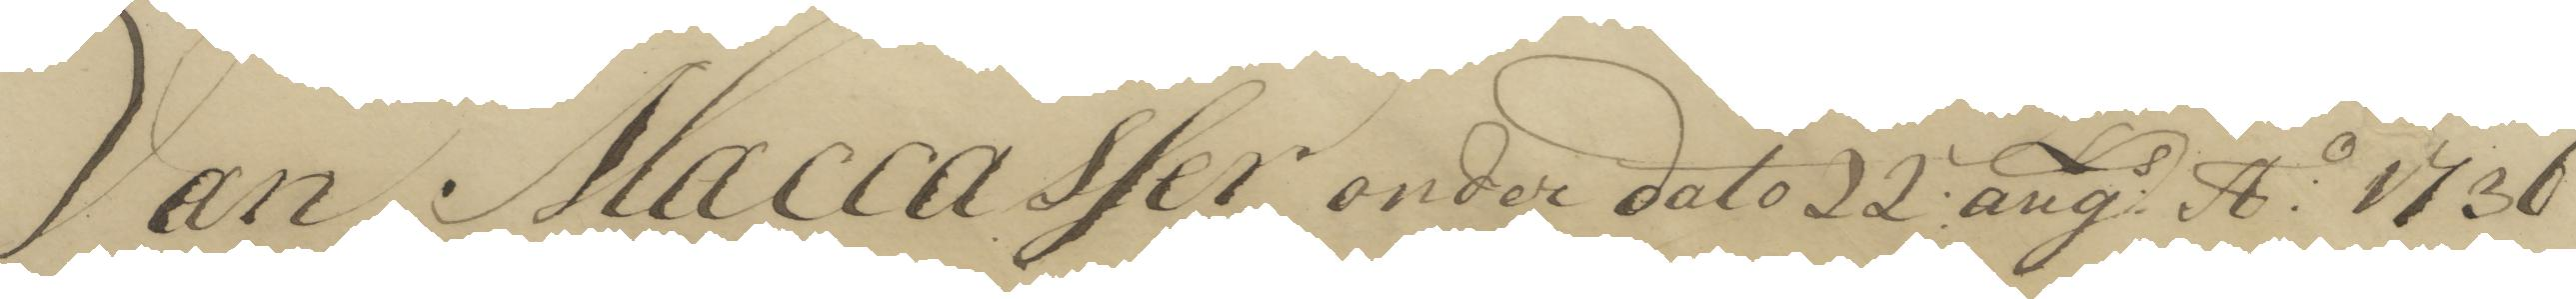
Van Maccasser onder dato 22:' aug:s A:o 1736
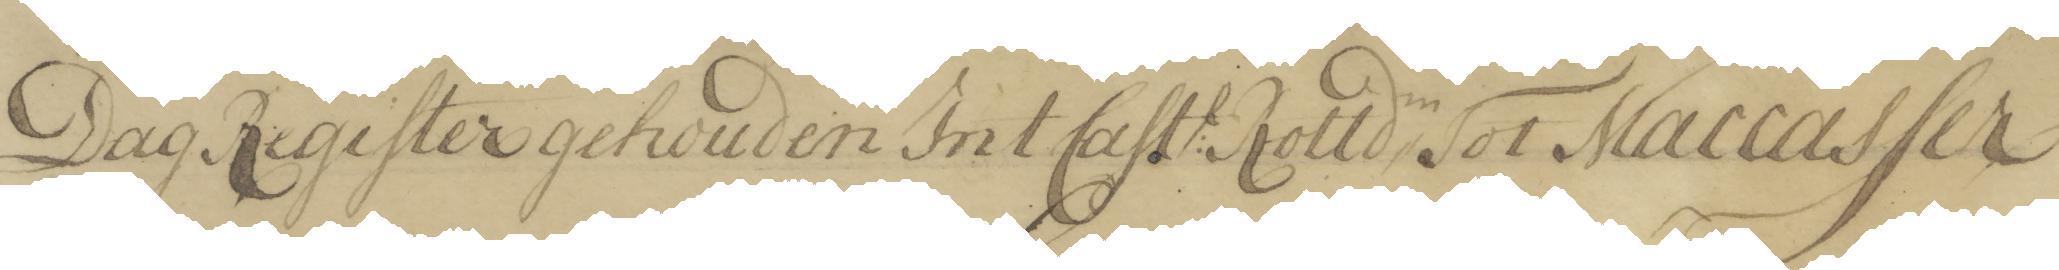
Dag Register gehouden Int Cast:l Rottd„m Tot Maccasser
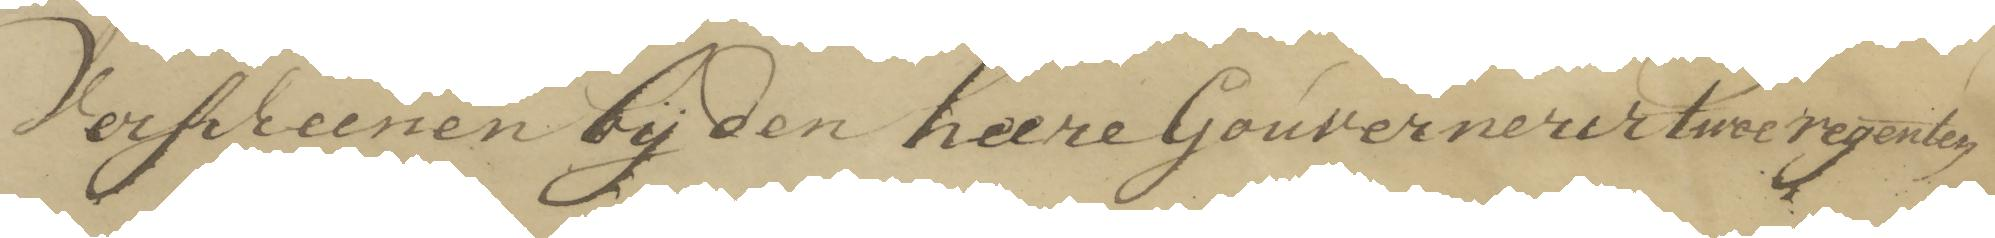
Verscheenen bij den heere Gouverneur twee regenten
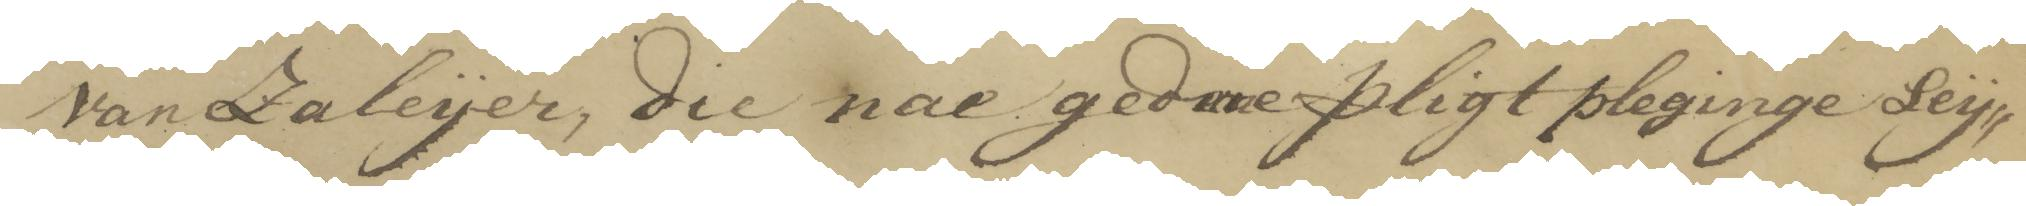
van zaleijer, die nae gedane pligt pleginge seij„
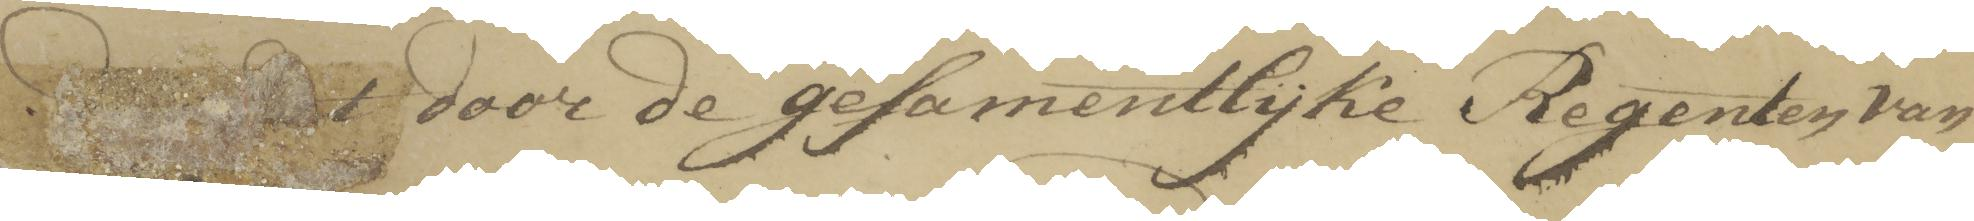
de omdat door de gesamentlijke Regenten van
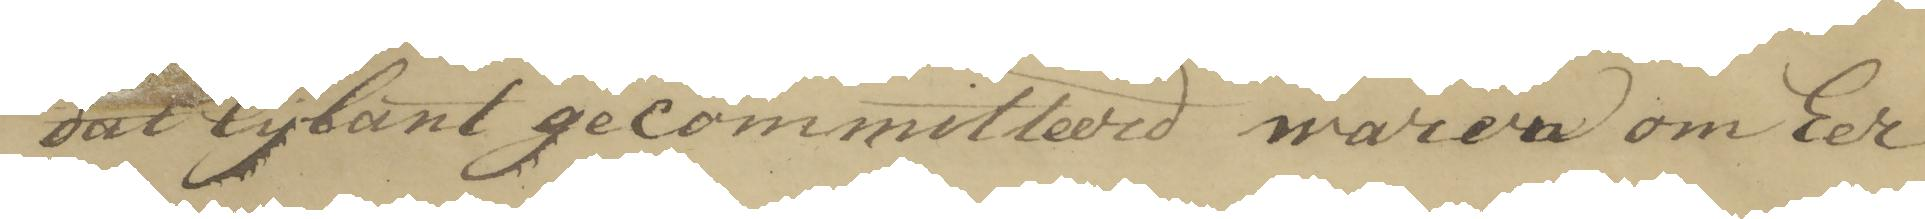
dat Eijlant gecommitteerd waren om her
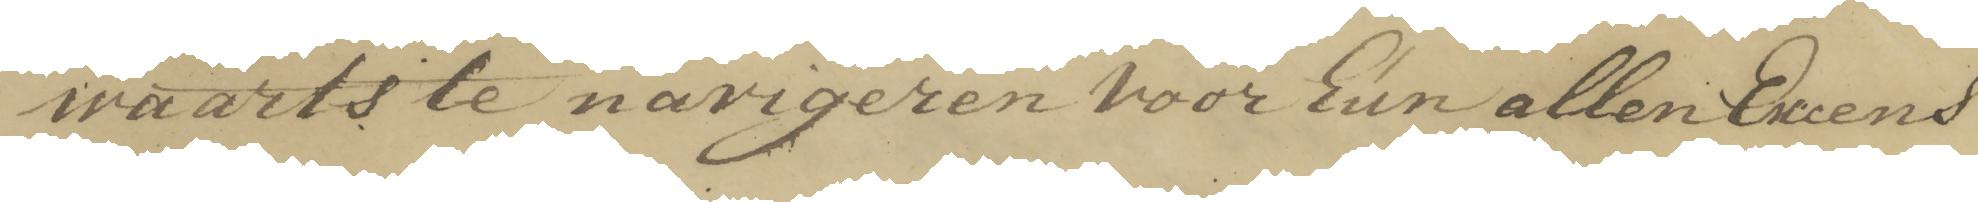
waarts te navigeren voor hun allen Excens
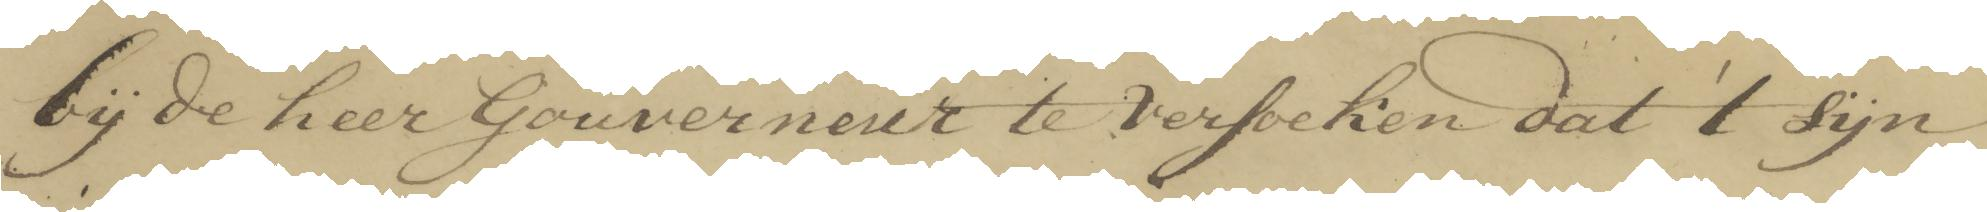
bij de heer Gouverneur te versoeken dat ’t sijn
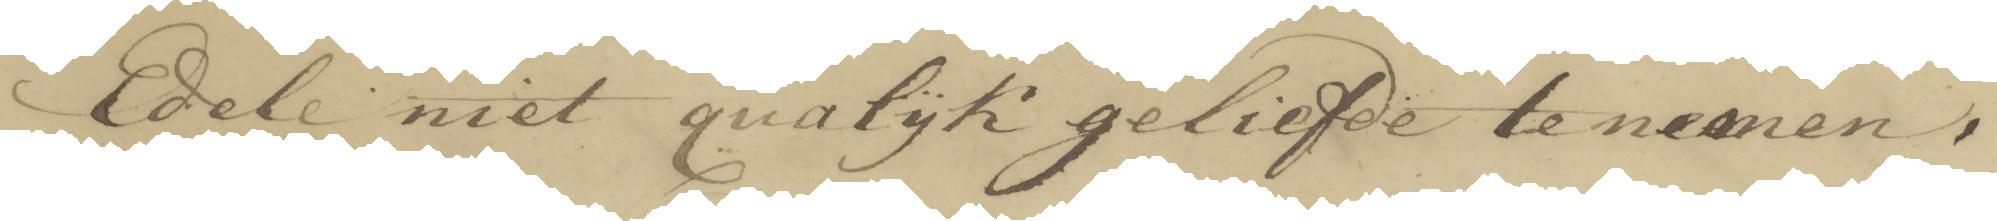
Edele niet qualijk geliefde te nemen,
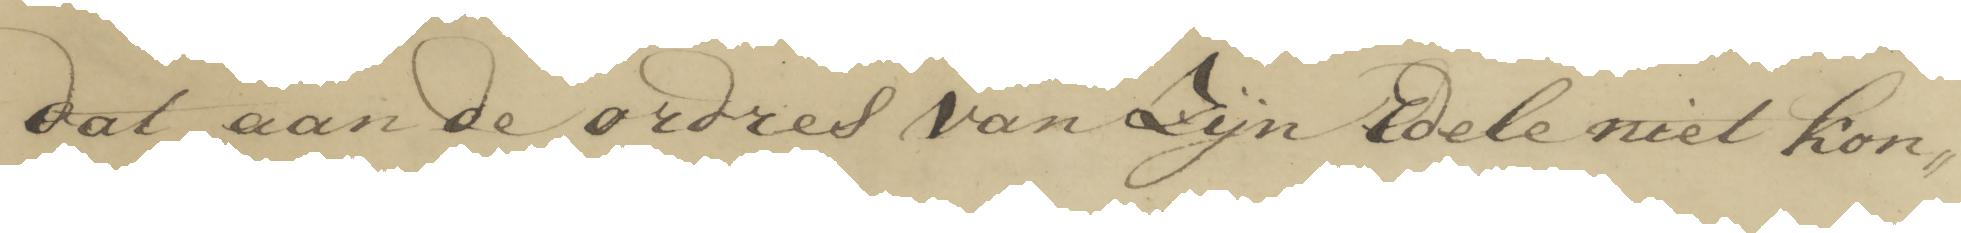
dat aan de ordres van zijn Edele niet kon„
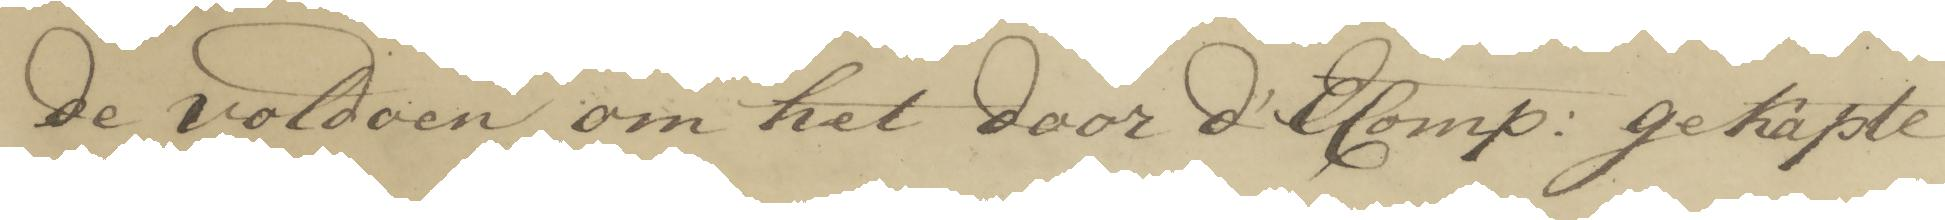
de voldoen om het door d’EComp: gekapte
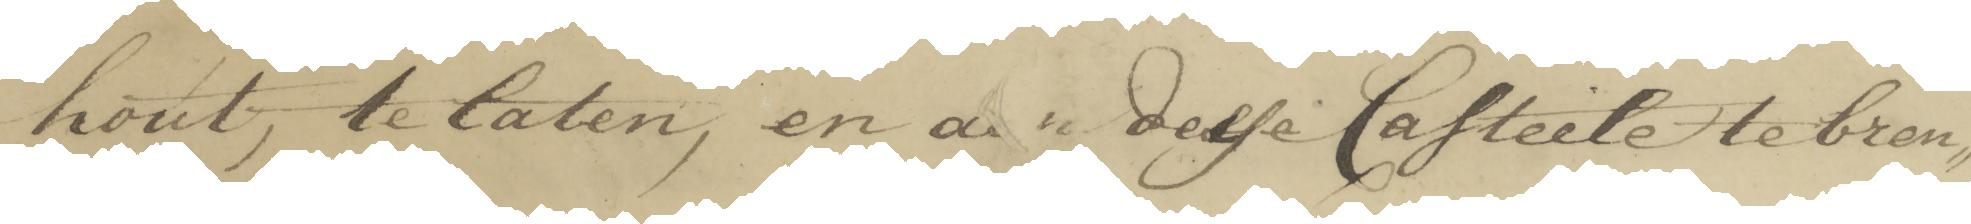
hout, te laten, en aen desse Casteele te bren
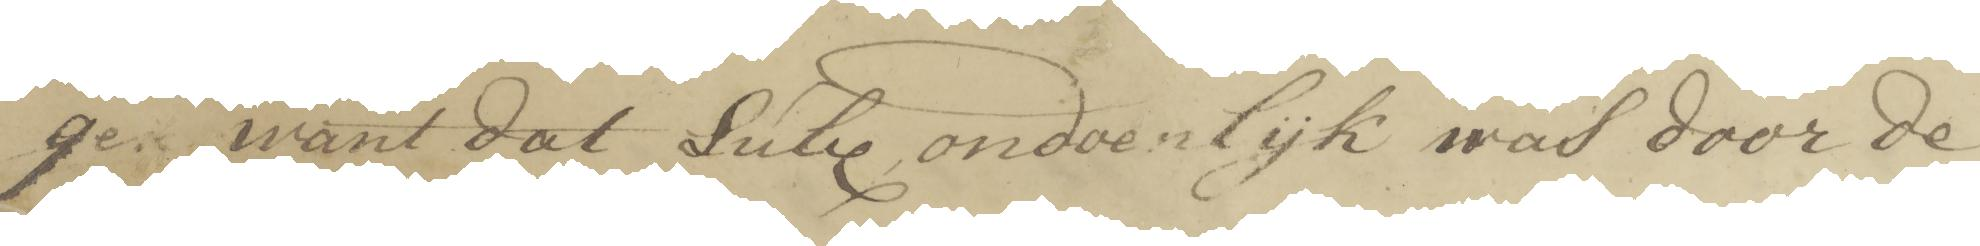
ge want dat sulx, ondoenlijk was door de
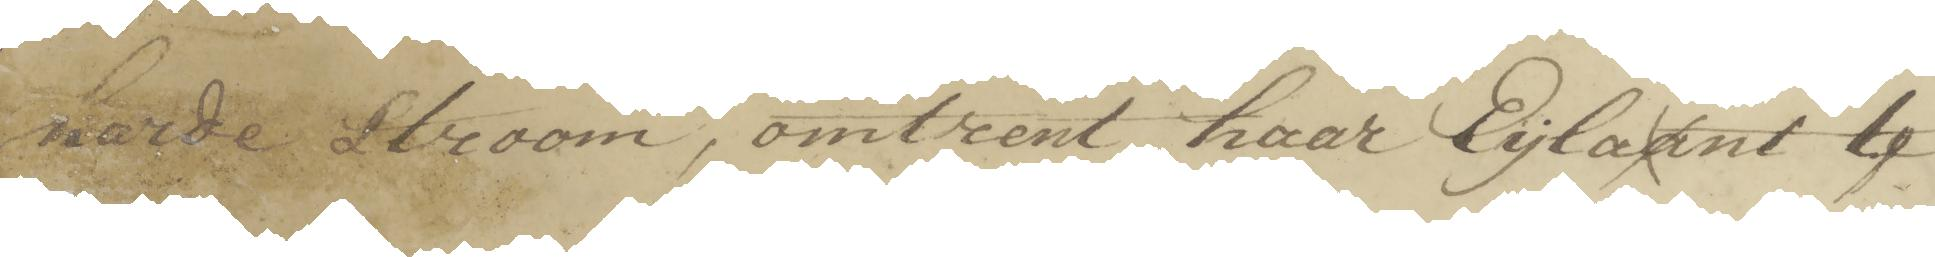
harde stroom, omtrent haar Eijlaant 'te
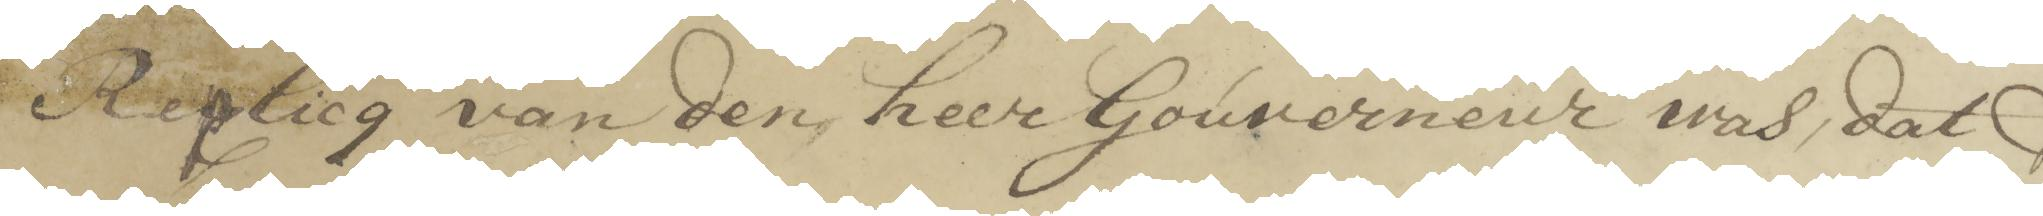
Replicq van den heer Gouverneur was, dat
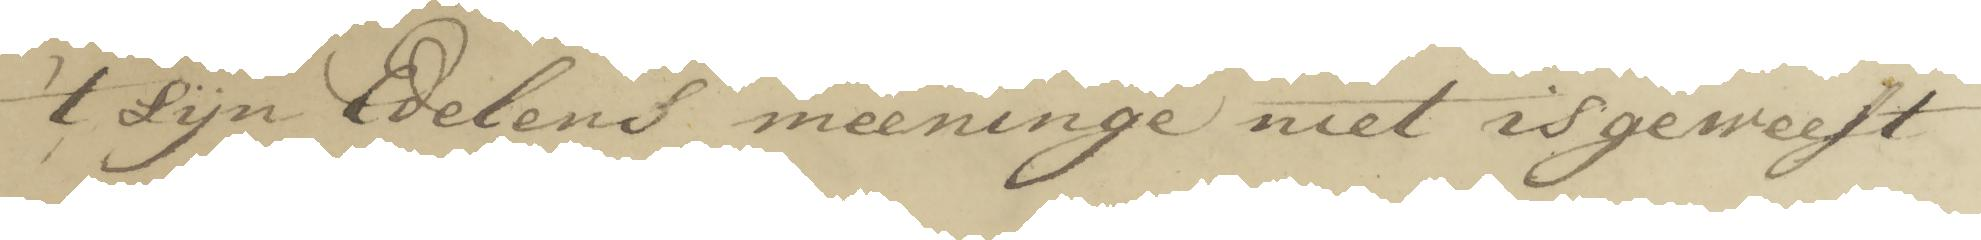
’t sijn Edelens meeninge niet is geweest
